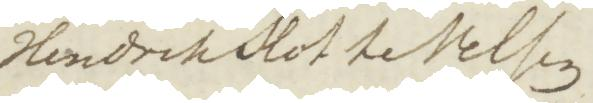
Hendrik Slot te Velsen
